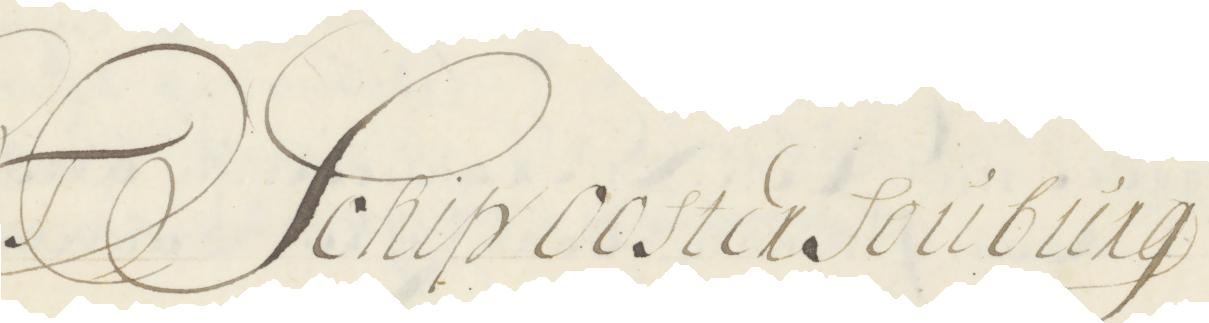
T Schip ooster souburg
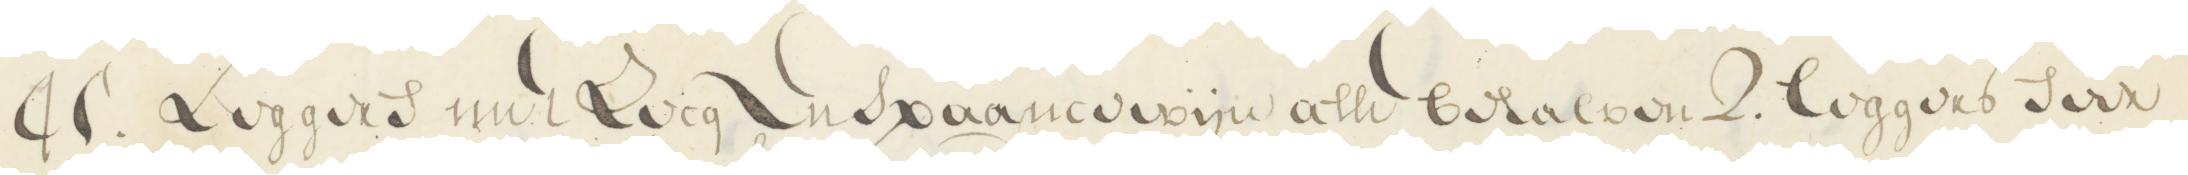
45. Leggers met zecq en spaance wijn alle behalven 2. leggers seer
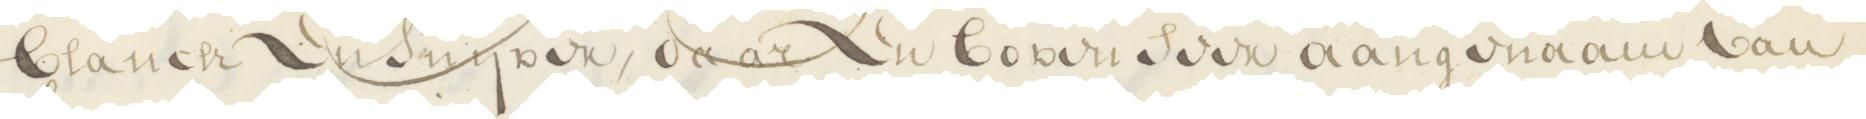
blanck en suijver, daar en boven seer aangenaam van
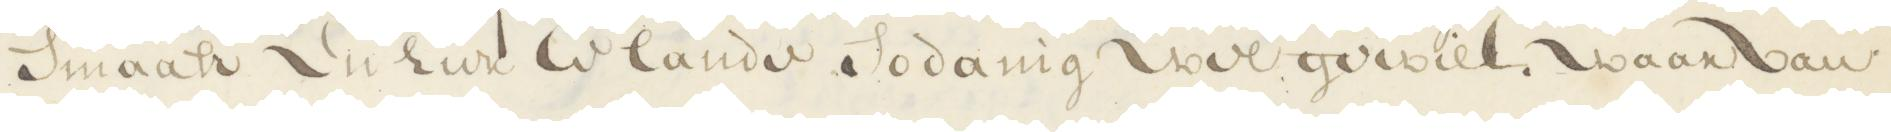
smaak en hier te lande sodanig wel gewilt, waarvan
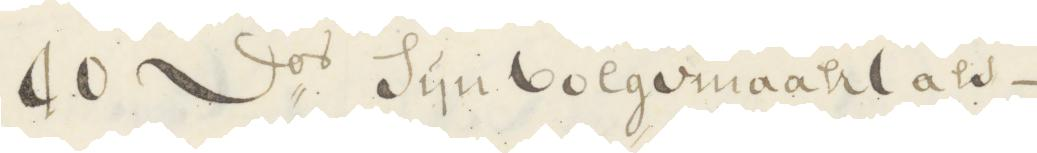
40 D„os sijn volgemaakt als
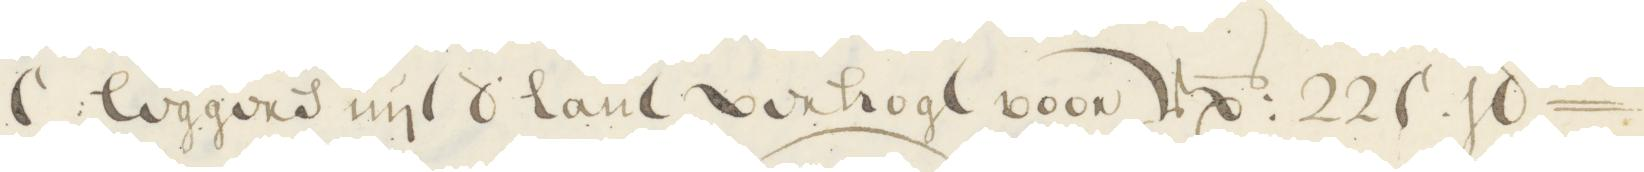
5: leggers uijt d’ hant verkogt voor Rx:s 225. jd=e
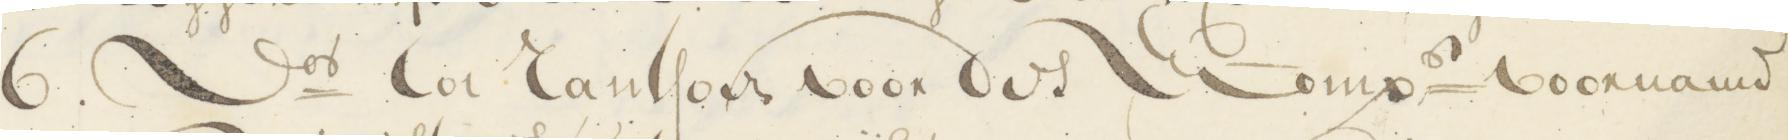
6. D=os tot rantsoen voor des EComp=s voorname
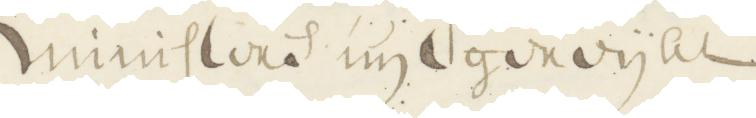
ministers uijt gereijkt
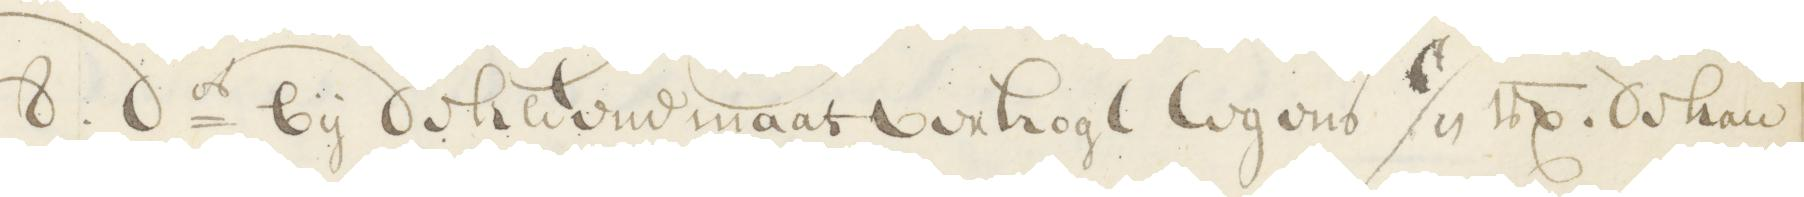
8. d=os bij dekleene maat verkogt tegens 5/4 Rx. de kan
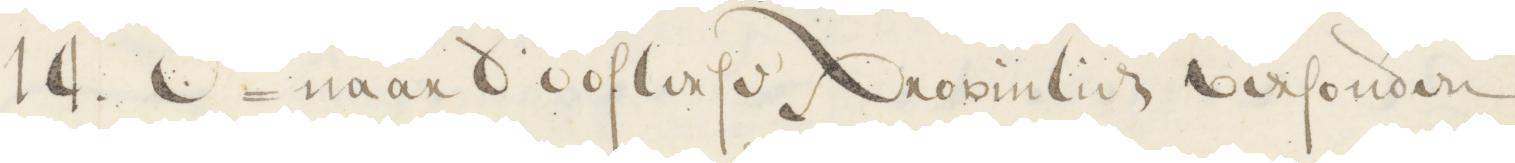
14. D=os naar d’oosterse provintien versonden
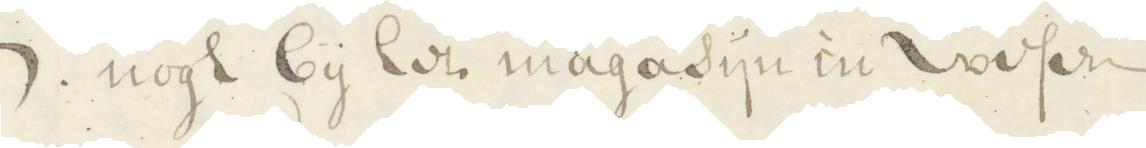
7. nogh bij het magasijn in wesen
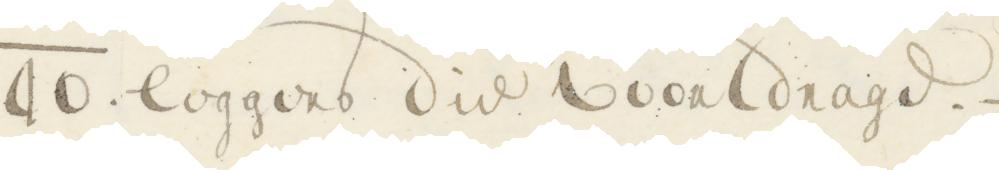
40. leggers die voortdrage.
